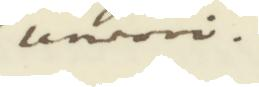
renovoi.
